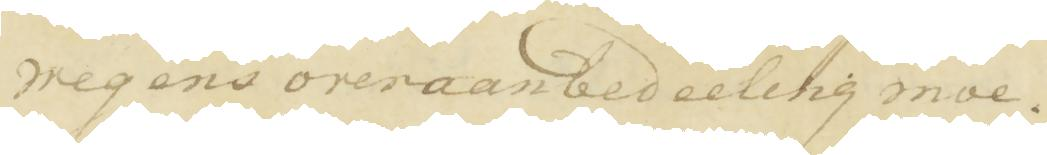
wegens overaanbedeeling moe,
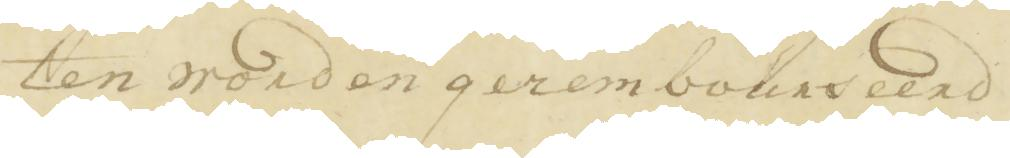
–ten worden gerembourseerd
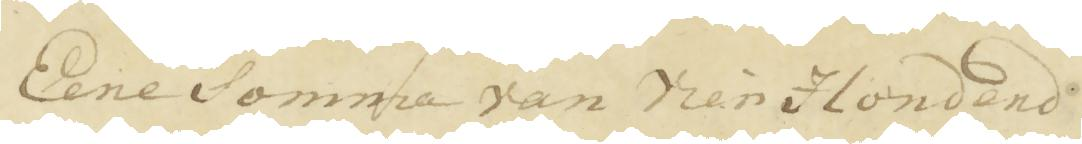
Eene somma van Vier Honderd
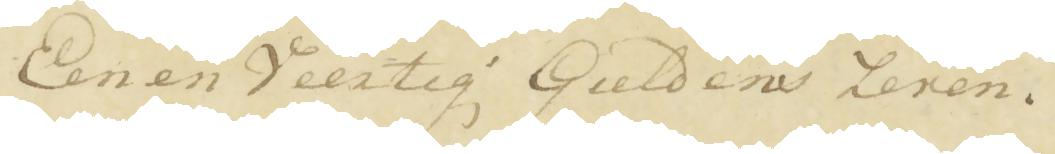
Een en Veertig Guldens Zeven,.
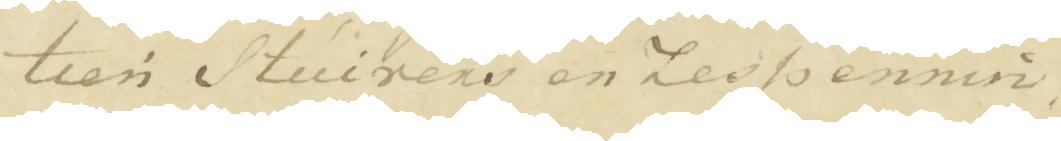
=tien Stuivers en Zes pennin,
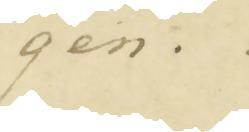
gen . - - - - - - - - - - - - „ 441. 17 6
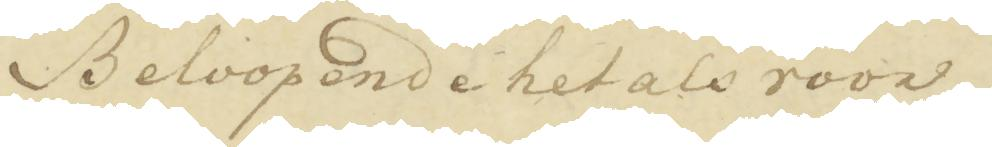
Beloopende het als voor
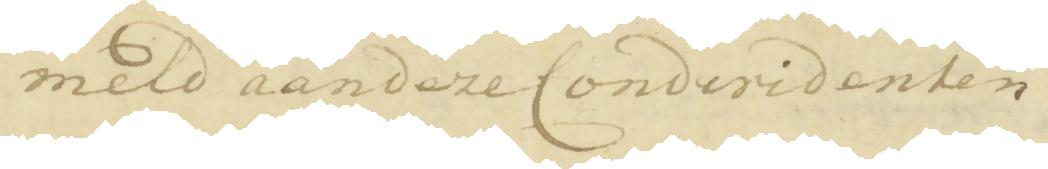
=meld aan deze Condividenten
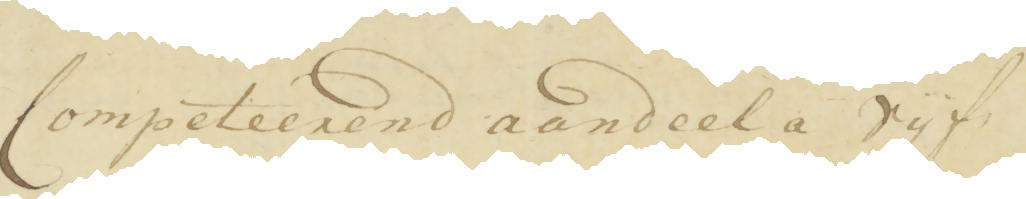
Competeerend aandeel a Vijf
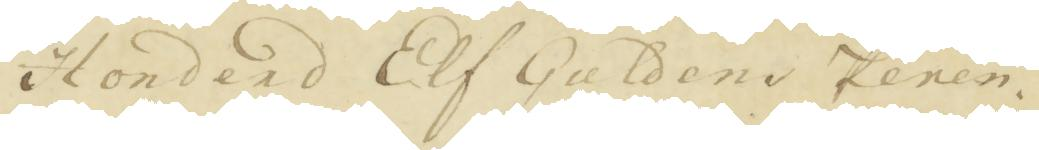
Honderd Elf Guldens Zeven,
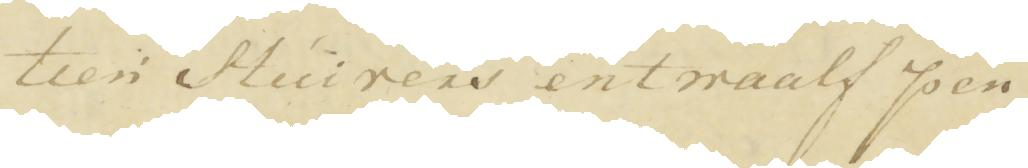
=tien stuivers en twaalf pen.
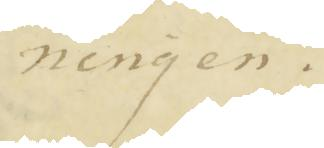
ningen . . . . . . . . . . . . . . . ƒ 511. 17. 12.
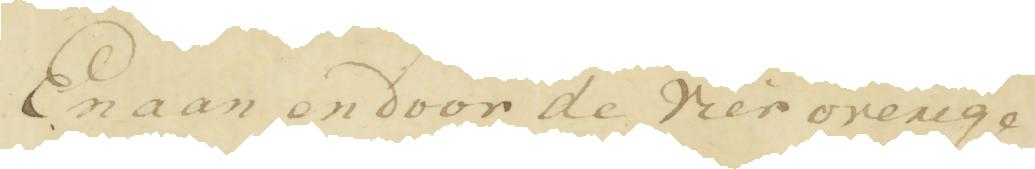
En aan en door de vier overige
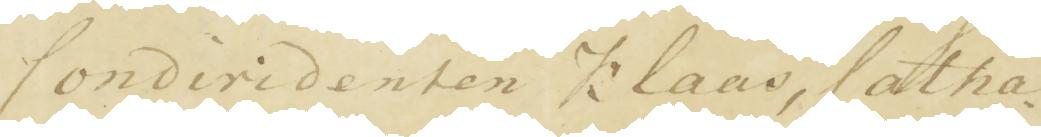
Condividenten Klaas, Catha,
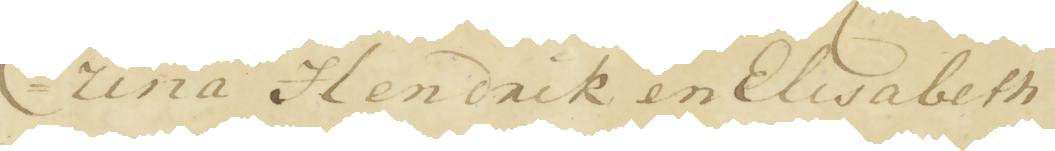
=rina Hendrik en Elisabeth
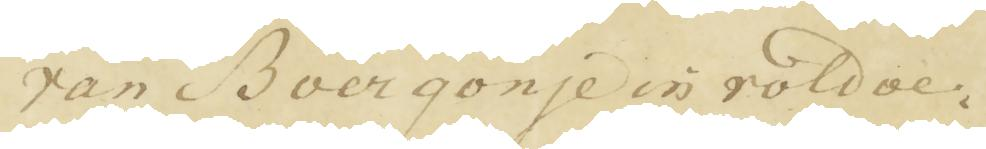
van Boergonje in voldoe„
